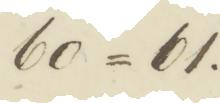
60 = 61.
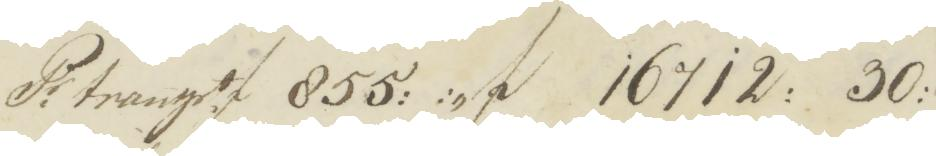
P.r Transp„t ƒ 855: :„ ƒ 16712: 30.
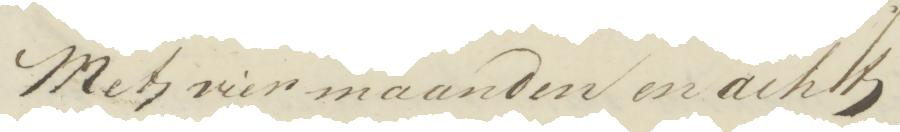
Met vier maanden en acht
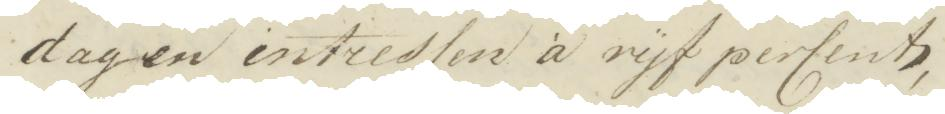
dagen intressen a vijf perCent,
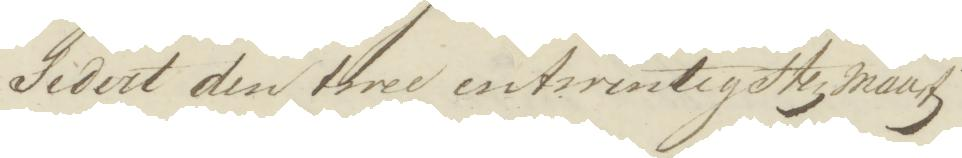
sedert den twee entwintigsten maart
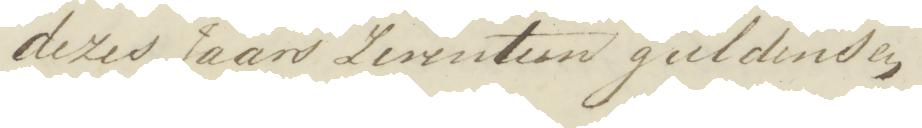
dezes Jaars Zeventien guldens en
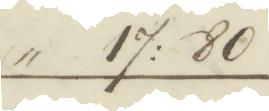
„ 17: 80
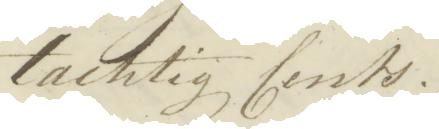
tachtig Cents.
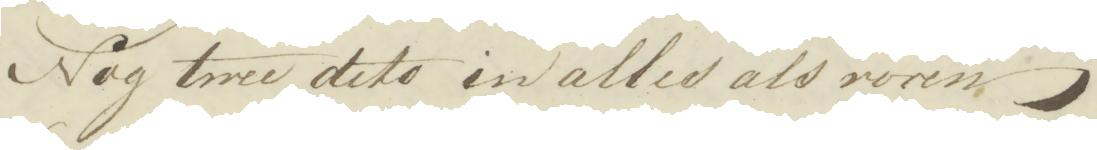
Nog twee dito in alles als voren
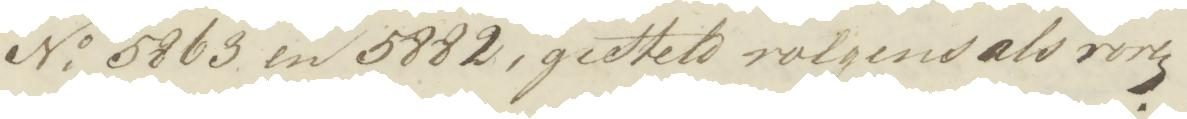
N,o 5863 en 5882, gesteld volgens als voren
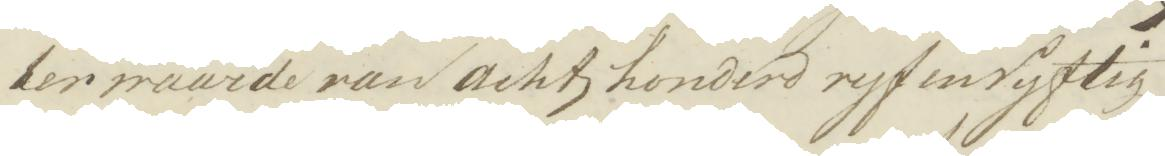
ter waarde van acht honderd vyf en vyftig
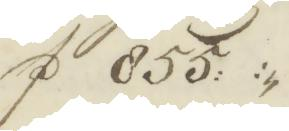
ƒ 855: :„
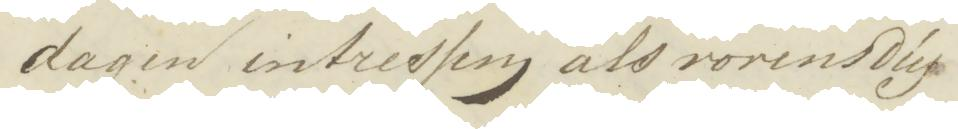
dagen intressen als vorens dus
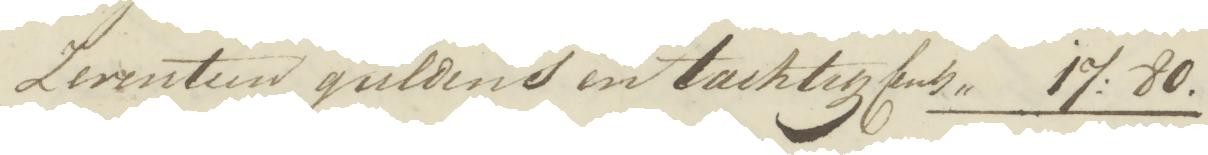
Zeventien guldens en tachtig Cents„ 17: 80.
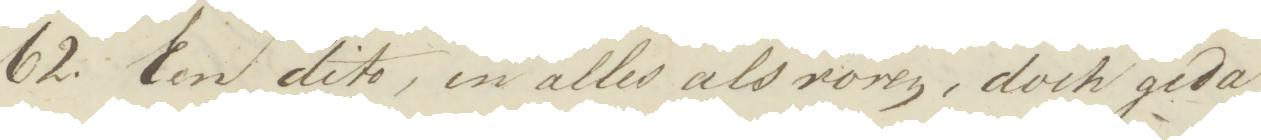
62. Een dito, in alles als voren, doch geda
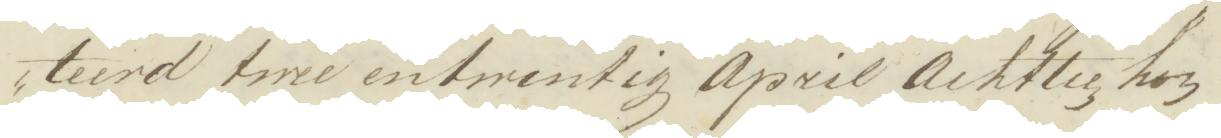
„teerd twee entwintig April Achttien hon
